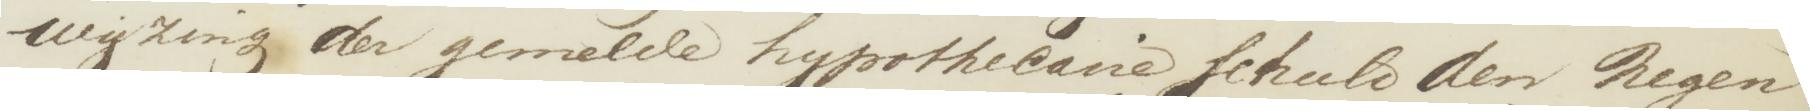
wijzing der gemelde hypothecaire schuld den negen
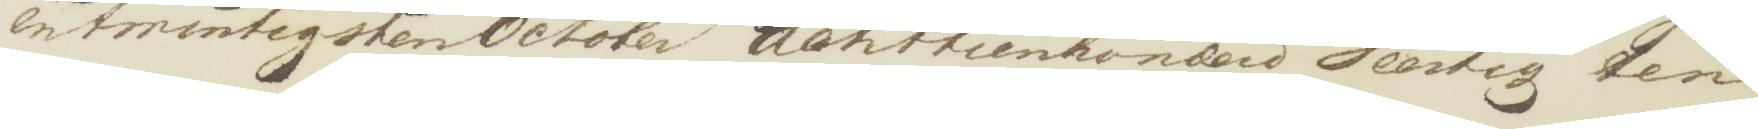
entwintigsten October achttienhonderd veertig ten
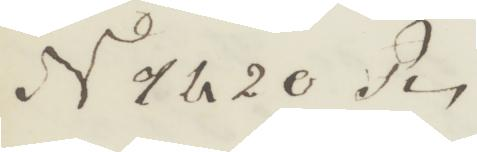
N 7420 R
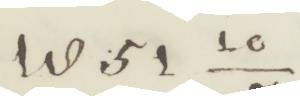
1851 10/7
